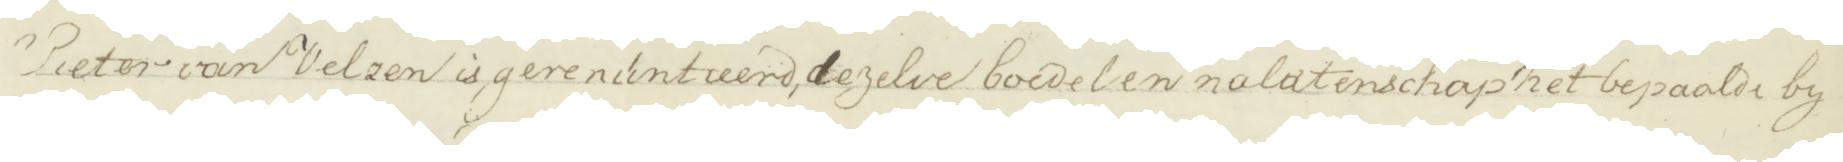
Pieter van Velzen is gerenuntieerd, dezelve boedelen nalatenschap het bepaalde by
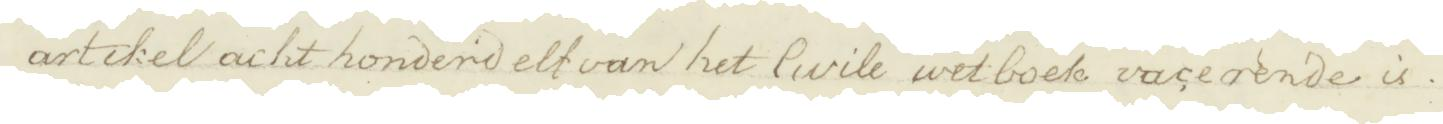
artikel acht honderd elf van het Civile wet boek vaçerende is.
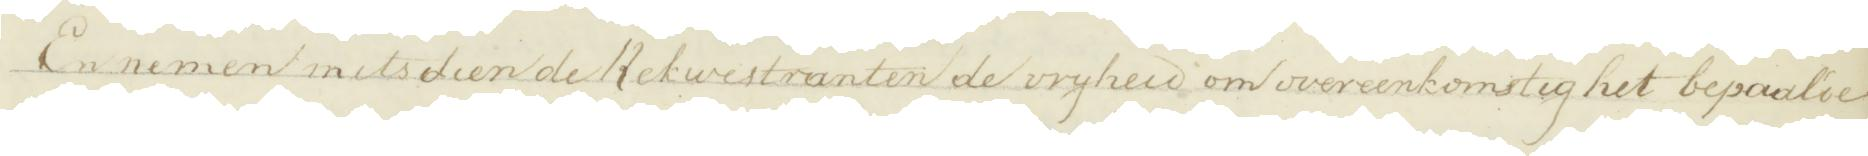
En nemen mitsdien de Rekwestranten de vryheid om over eenkomstig het bepaalde
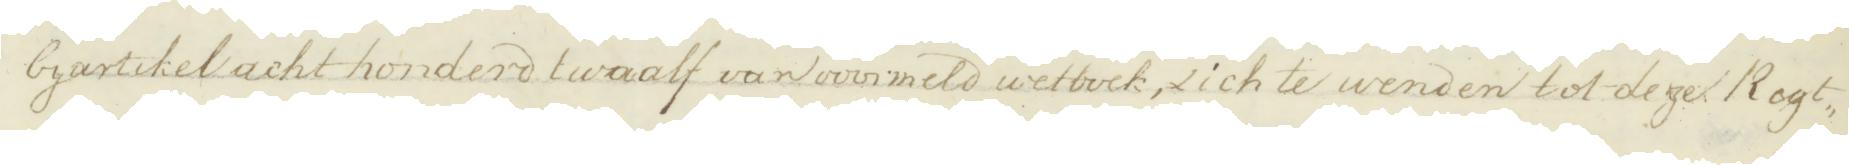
by artikel acht honderd twaalf van voormeld wetboek, zich te wenden tot dezer Regt„
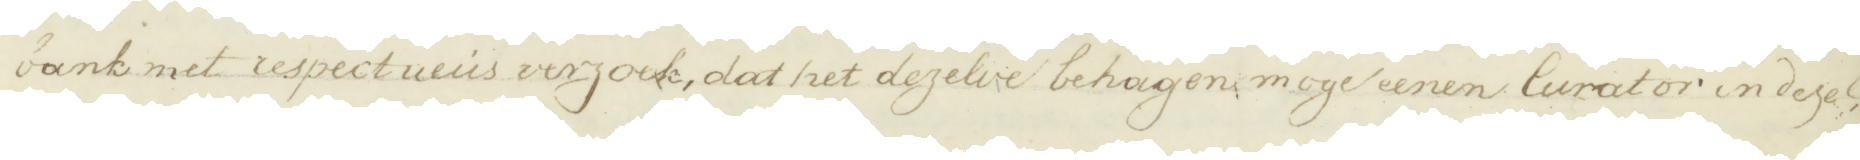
bank met respectueus verzoek, dat het dezelve behagen moge eenen Curator in dezel,
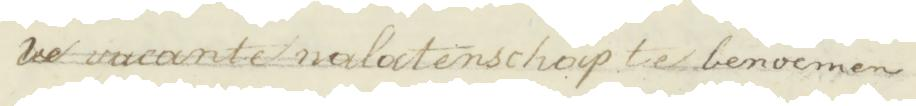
ve vacante nalatenschap te benoemen
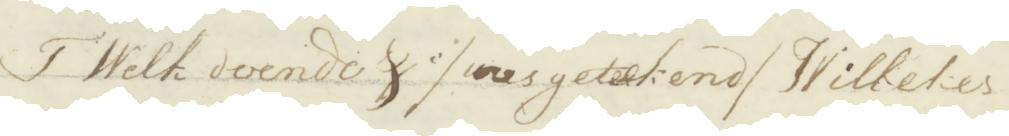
T Welk doende &: /was geteekend/ Wilkekes
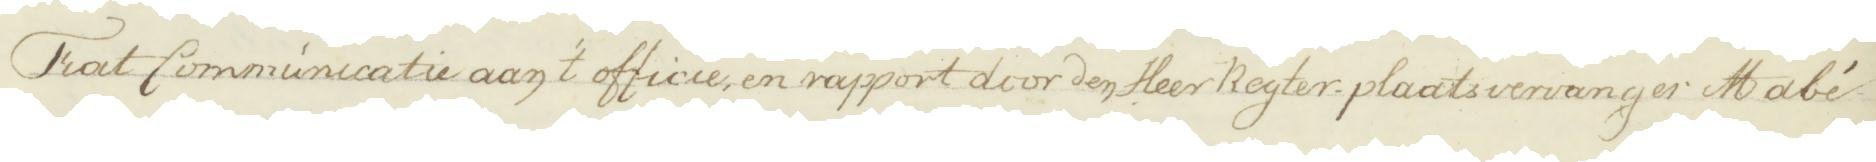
Fiat Communicatie aan ’t officie, en rapport door den Heer Regter plaats vervanger Mabé
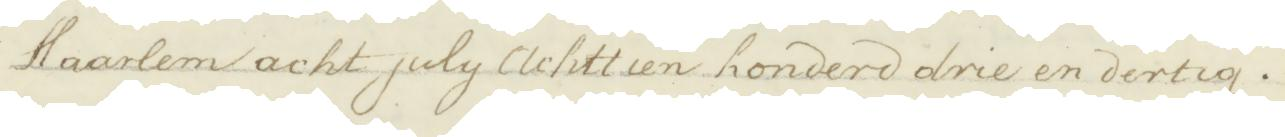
Haarlem acht july Achttien honderd drie en dertig.
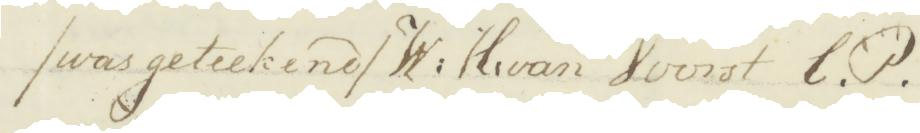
/was geteekend/ W: H van Voorst C: P.
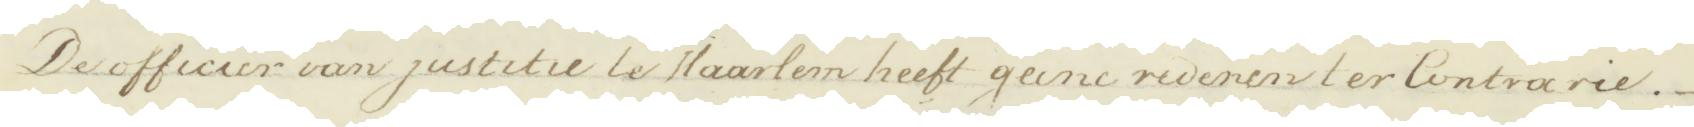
De officier van justitie te Haarlem heeft geene redenen ter Contrarie.
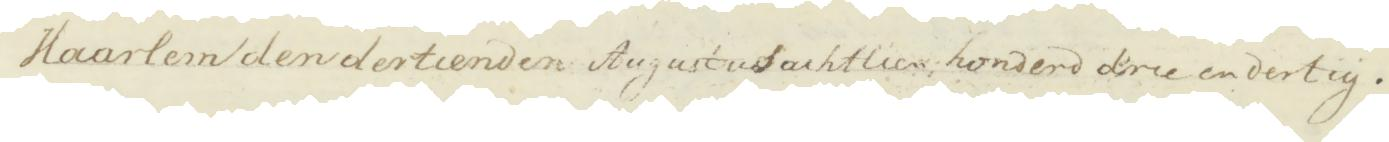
Haarlem den dertienden Augustus achttien, honderd drie en dertig.
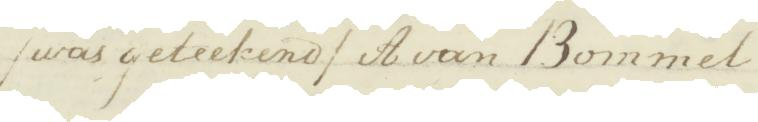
/was geteekend/ A van Bommel
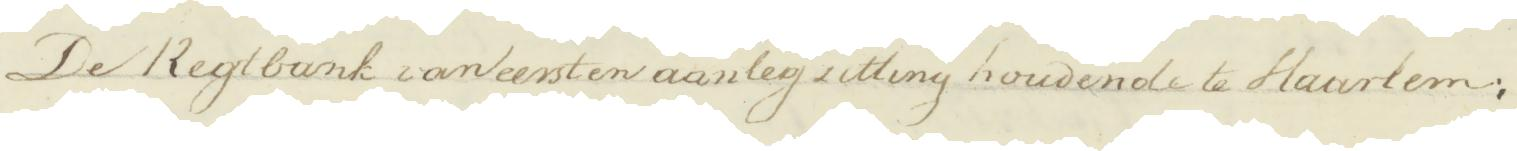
De Regtbank van eersten aanleg zitting houdende te Haarlem:
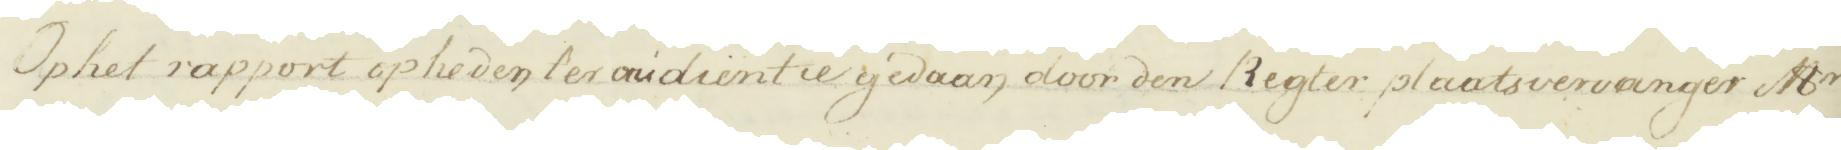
Op het rapport op heden ter audientie gedaan door den Regter plaats vervanger M=r
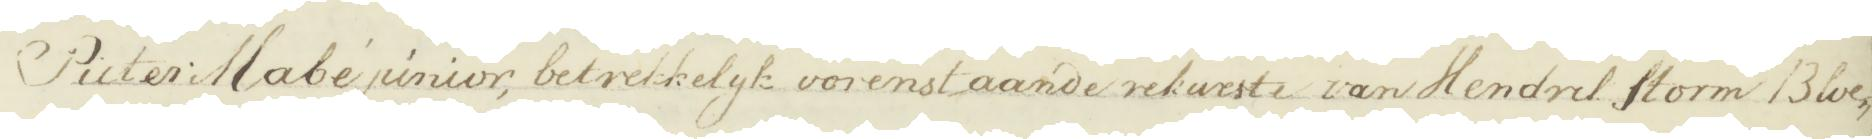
Pieter Mabe junior, betrekkelyk vorenstaande rekweste van Hendrik Storm Bloe„
